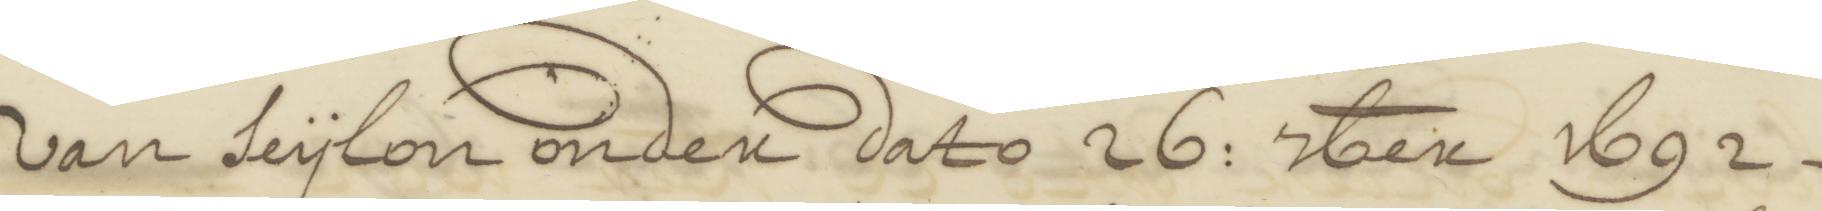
van seijlon onder dato 26: 7ber 1692
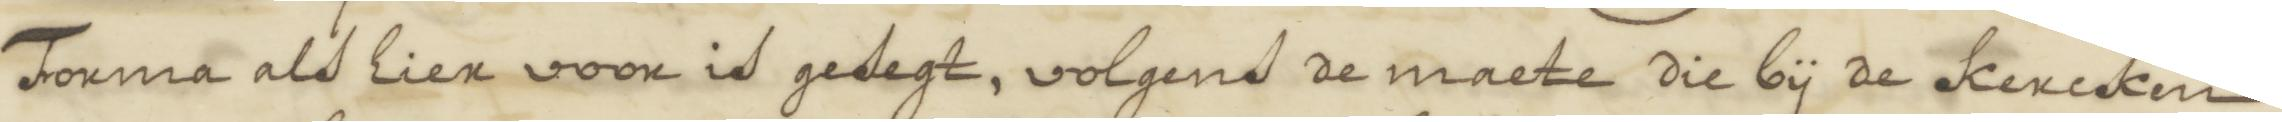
forma als hier voor is gesegt, volgens de maete die bij de kercken
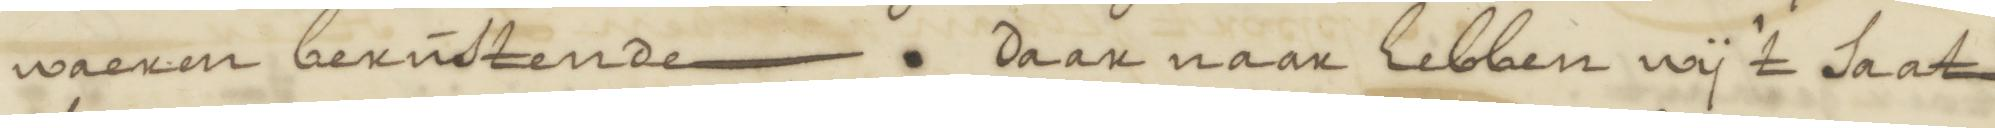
waeren berustende. daar naar hebben wij ’t saat
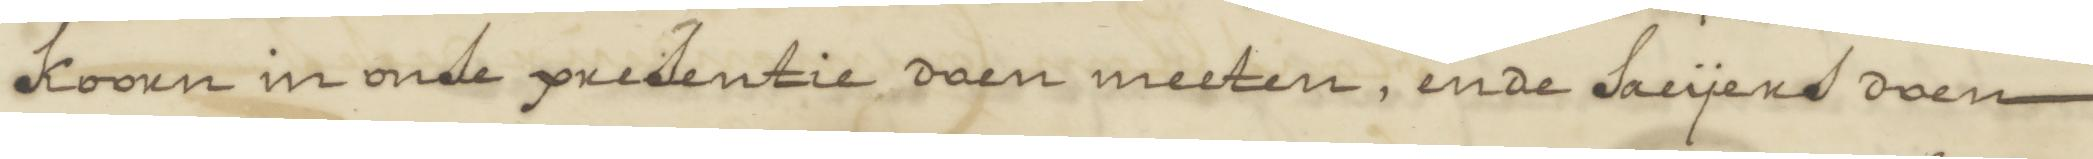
koorn in onse presentie doen meeten, ende saeijers doen
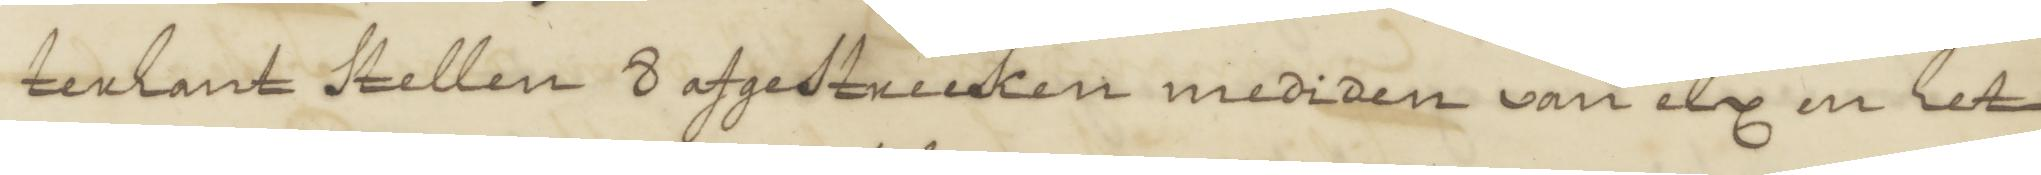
terhant stellen 8 afgestreeken mediden van elx en het
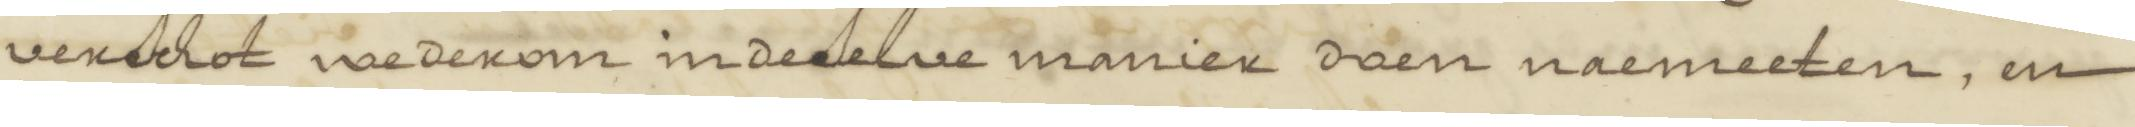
verschot wederom in deselve manier doen naemeeten, en
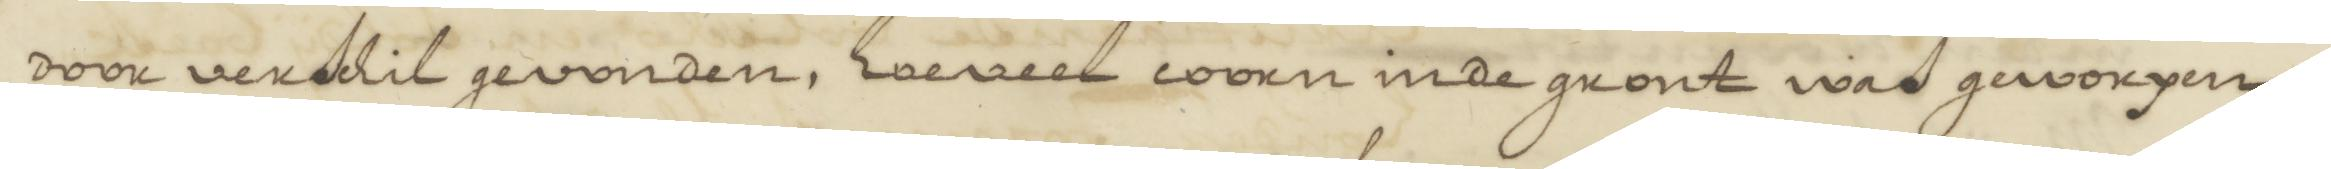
door verschil gevonden, hoeveel coorn in de gront was geworpen.
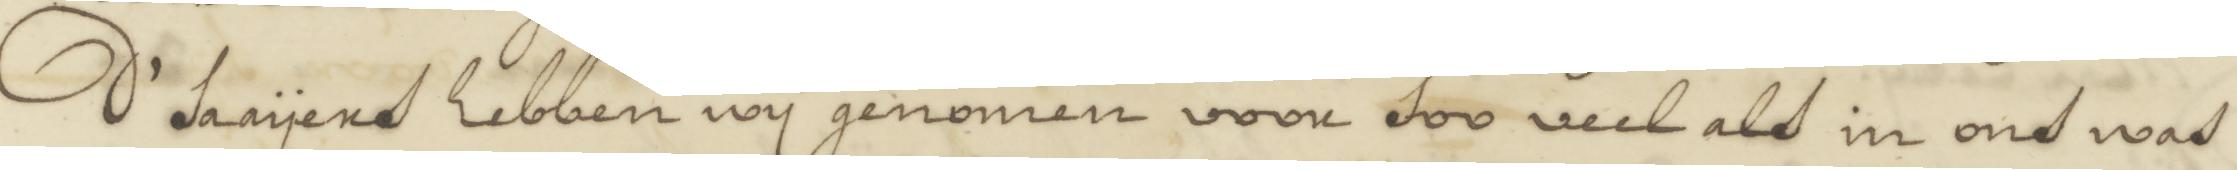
D’ saaijers hebben wij genomen voor soo veel als in ons was
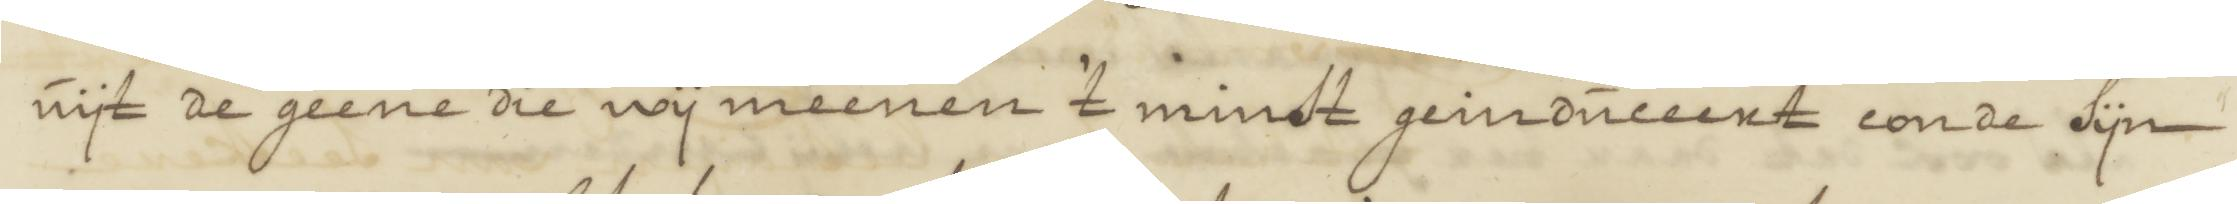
uijt de geene die wij meenen ’t minst geinduceert conde sijn
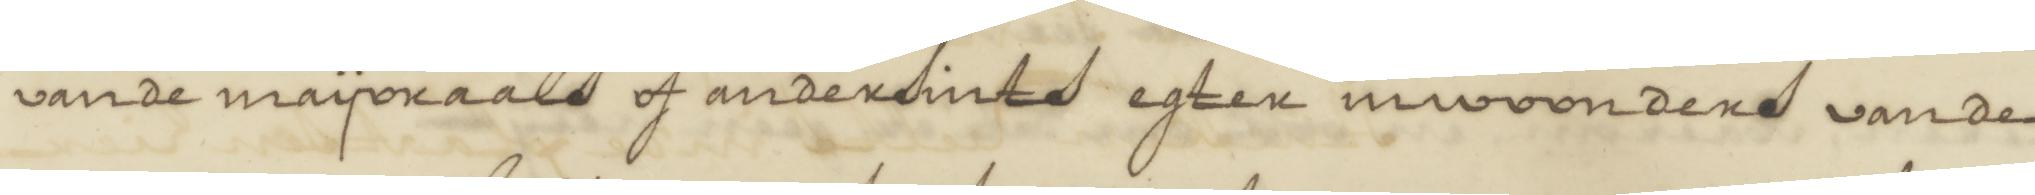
van de maijvraals of andersints egter inwoonders van de
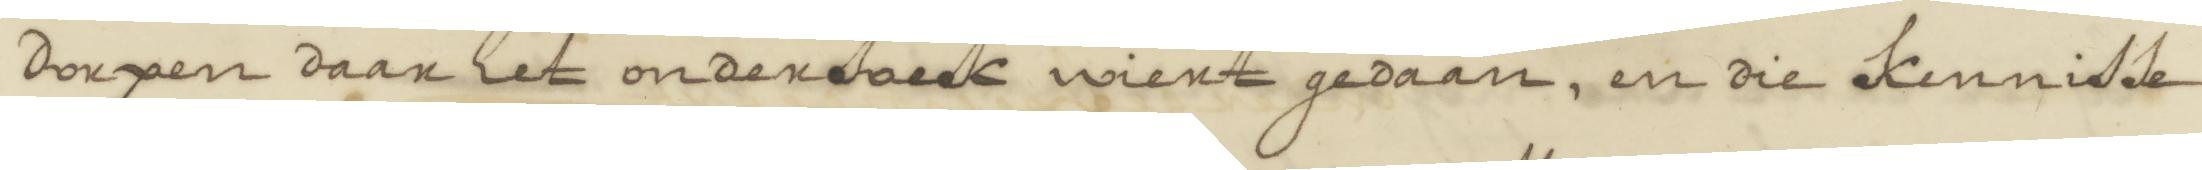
dorpen daar het ondersoek wiert gedaan, en die kennisse
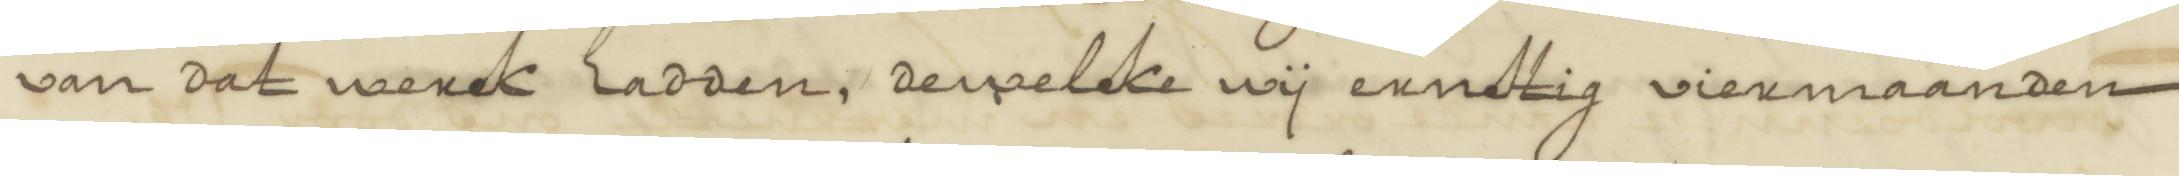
van dat werk hadden, dewelke wij ernstig viermaanden
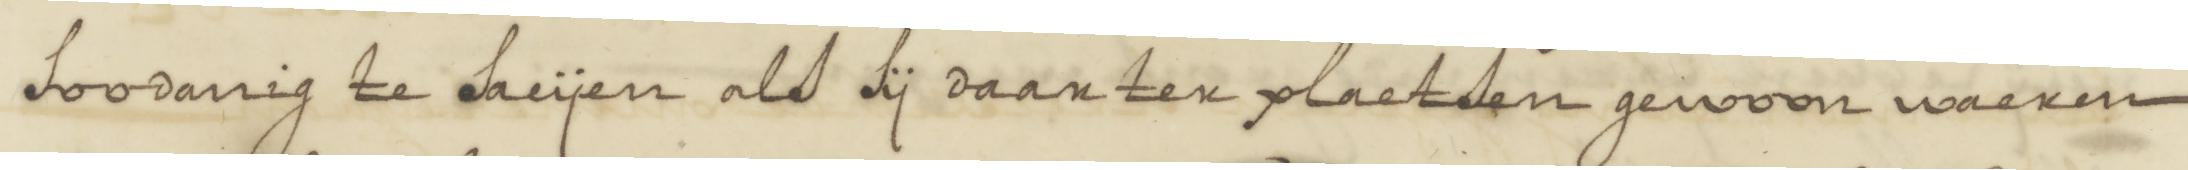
soodanig te saeijen als sij daar ter plaetsen gewoon waeren
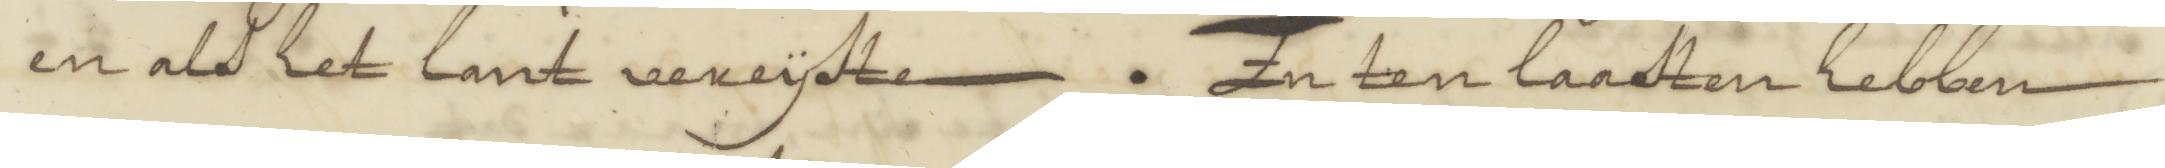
en als het lant vereijste. En ten laasten hebben
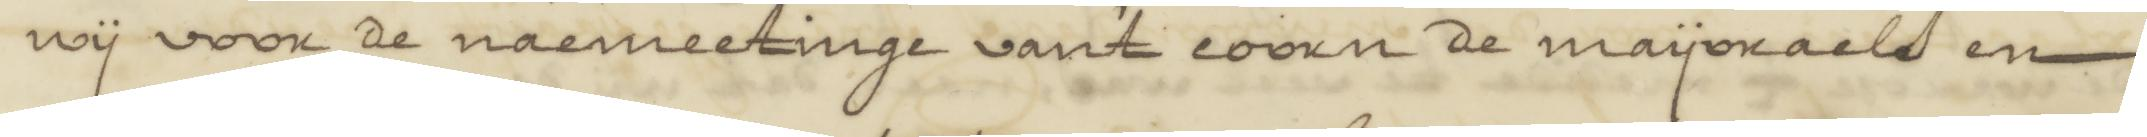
wij voor de naemeetinge van’t coorn de maijvraels en
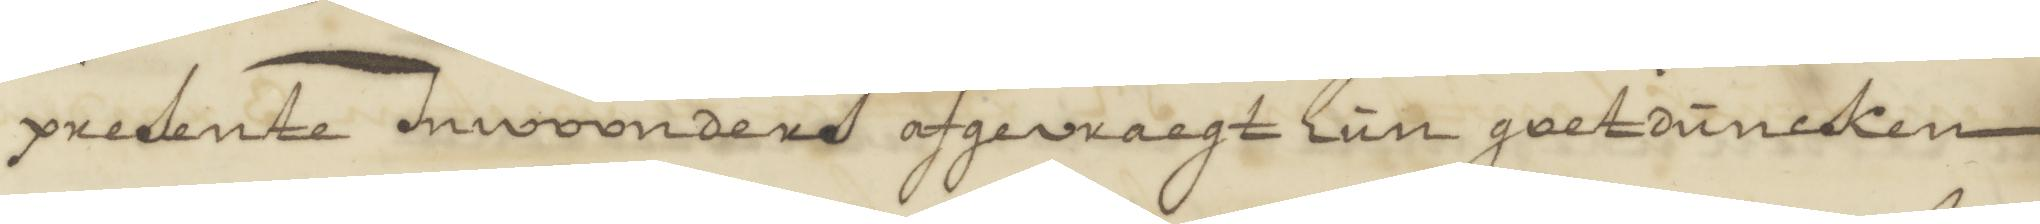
presente Inwoonders afgevraagt hun goetduncken
